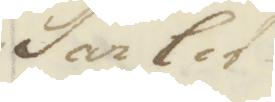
Sarles
